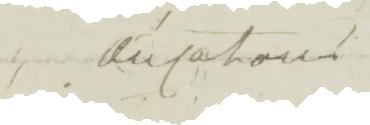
ducatons
